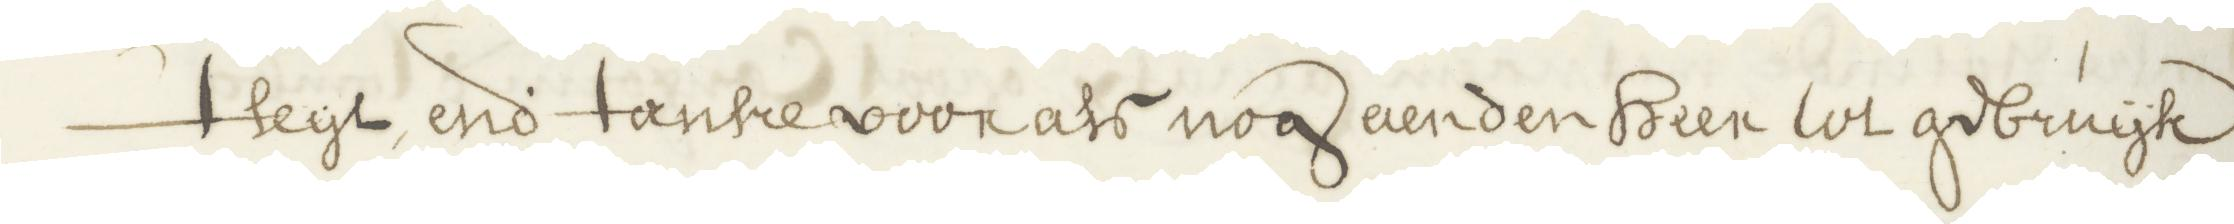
'tleijt, end' tanke voor als nog aen den heer tot gebruijk
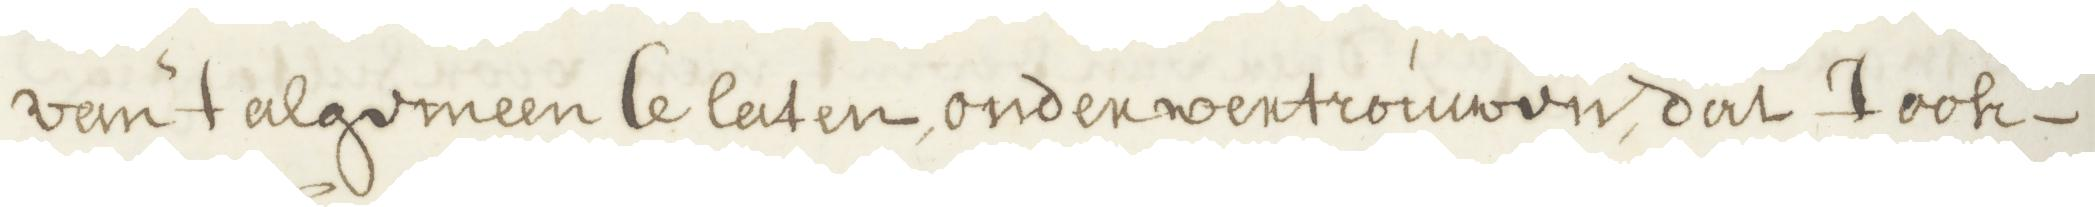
van ’t algemeen te laten, onder vertrouwen, dat ’t ook
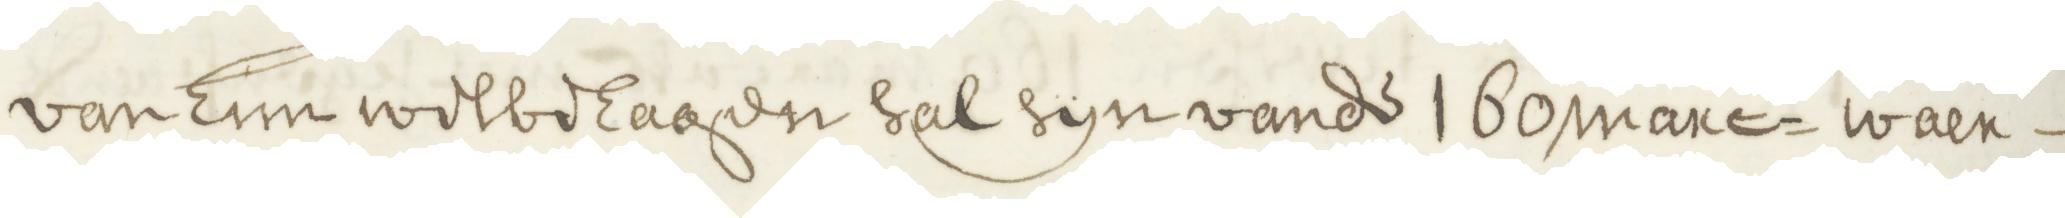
van hun welbehagen sal sijn vande 160 marc=s waer
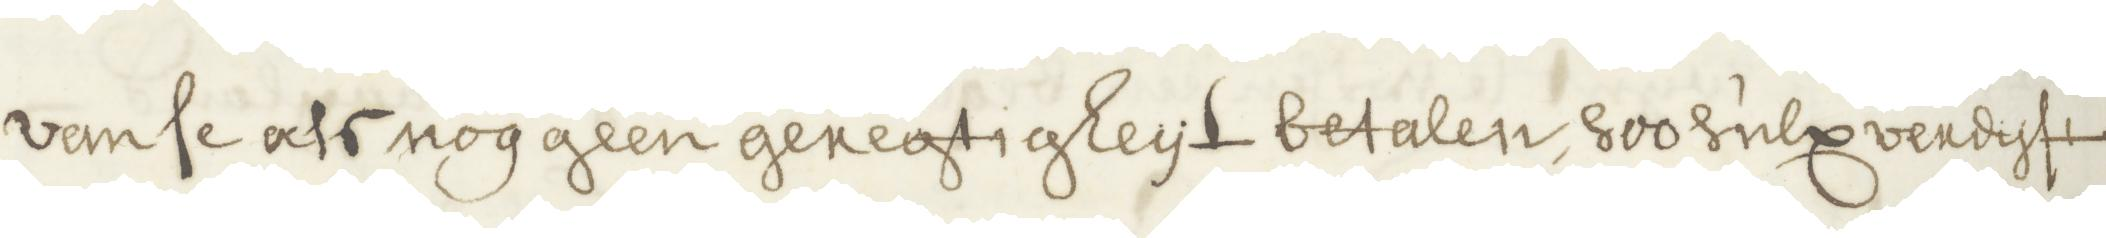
van se als nog geen geregtigheijt betalen, soo sulx vereijst
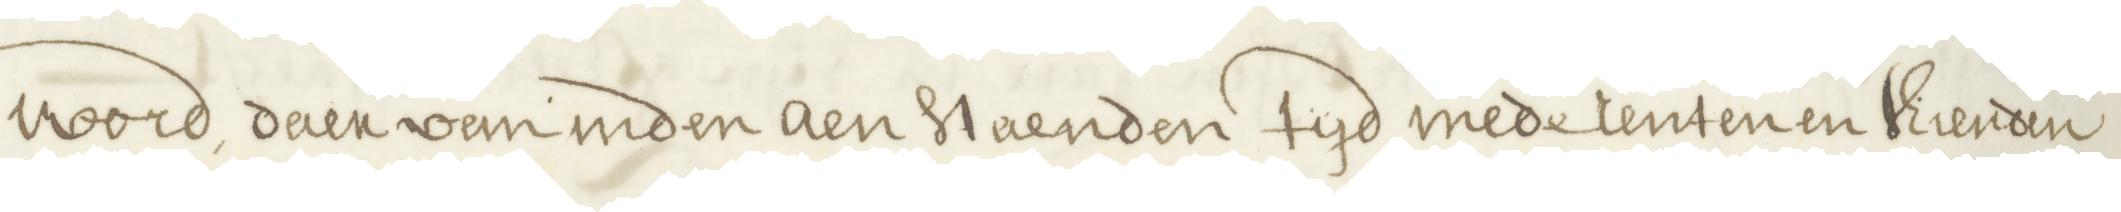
word, daer van inden aen staenden tijd mede renten en thienden
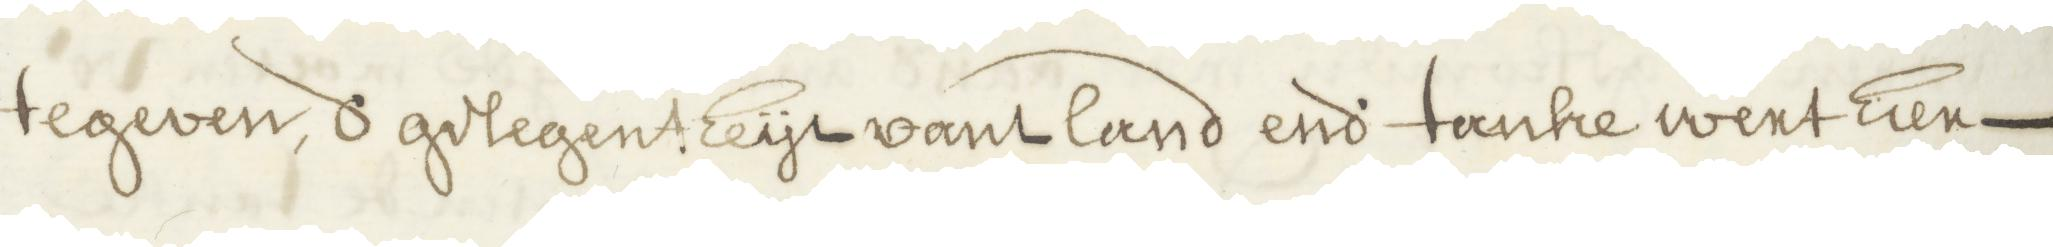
tegeven, d gelegentheijt vant land end’ tanke wert hier —
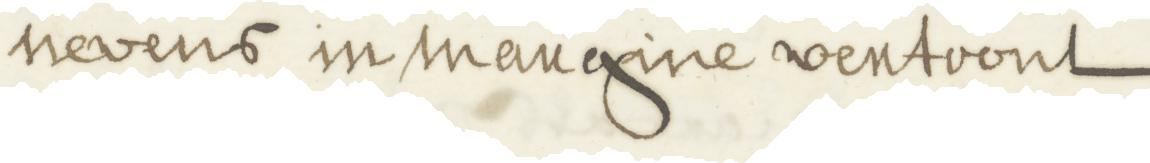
nevens in margine vertoont
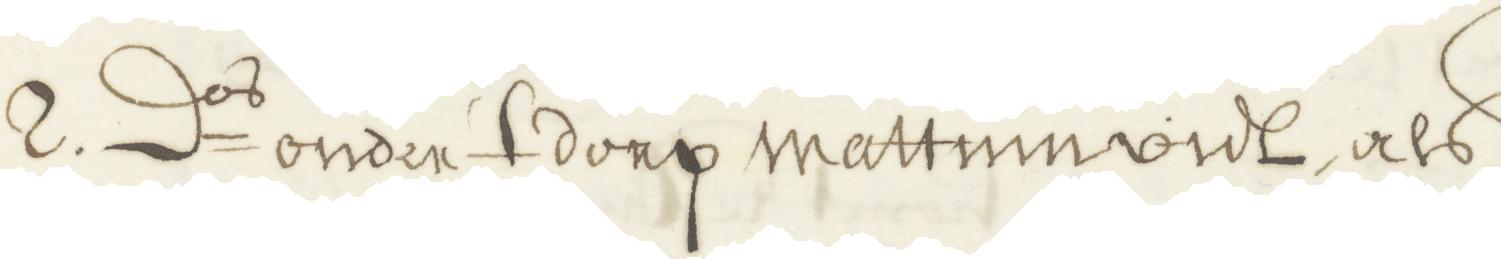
2. D=os onder ’t dorp mattumviel, als
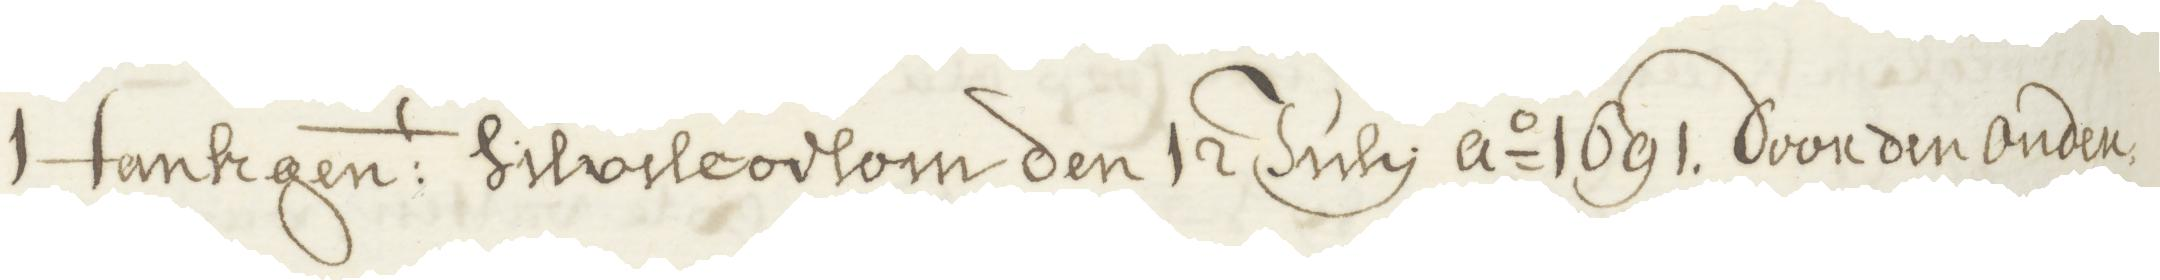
1 tank gen:t silvilcoelom den 12 Iulij a=o 1691. door den onder
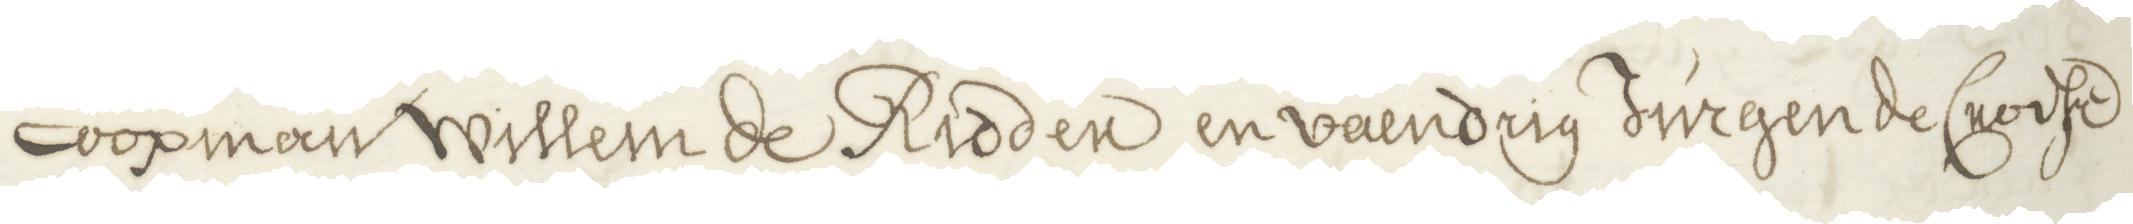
coopman Willem de Ridder en vaendrig Iurgen de Croese
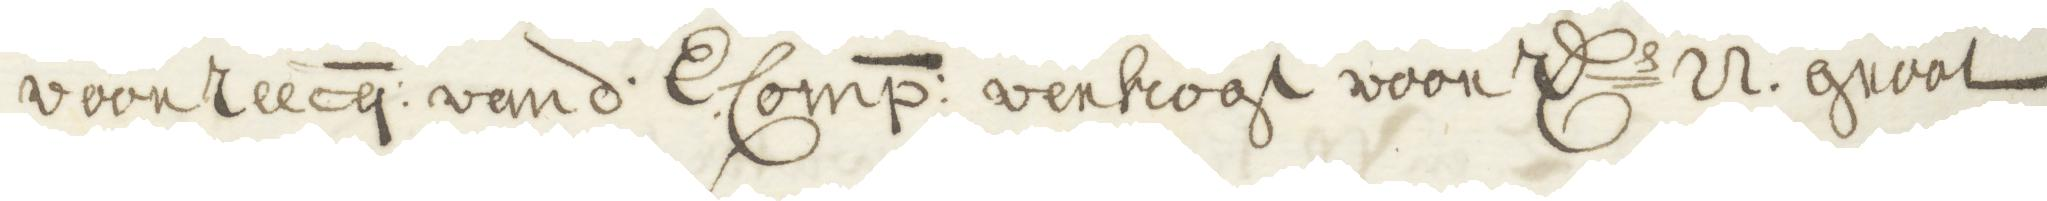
voor reecq: van d’ E: Comp: verkogt voor rx=s 22. groot
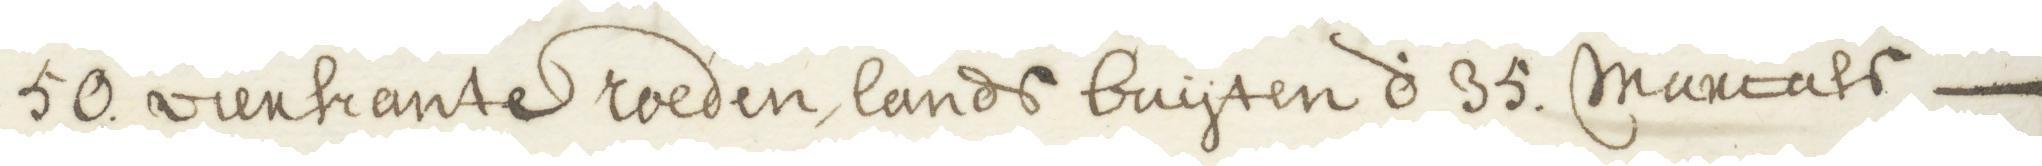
50. vierkante roeden, lands buijten d’ 35. marcals —
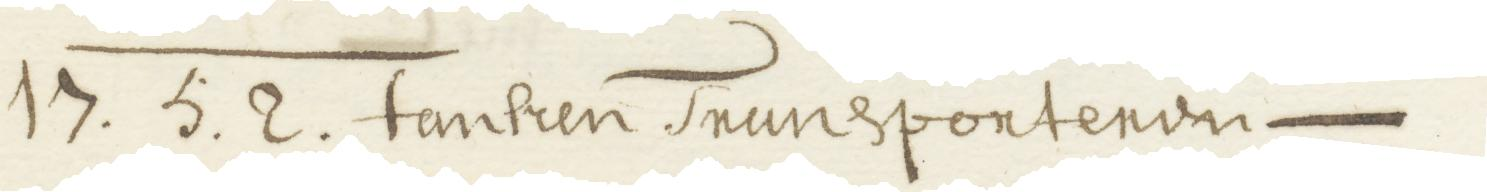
17. 5. 2. tanken Transporteren-
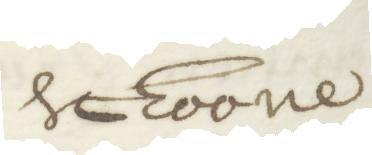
schoone
